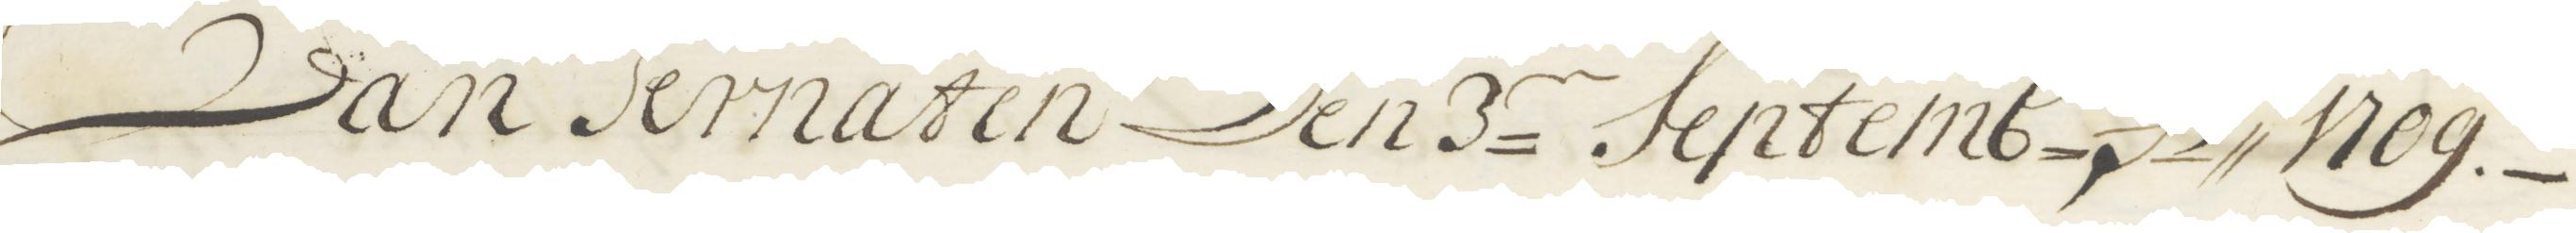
Van Ternaten Den 3=' Septemb=r A„o 1709. —
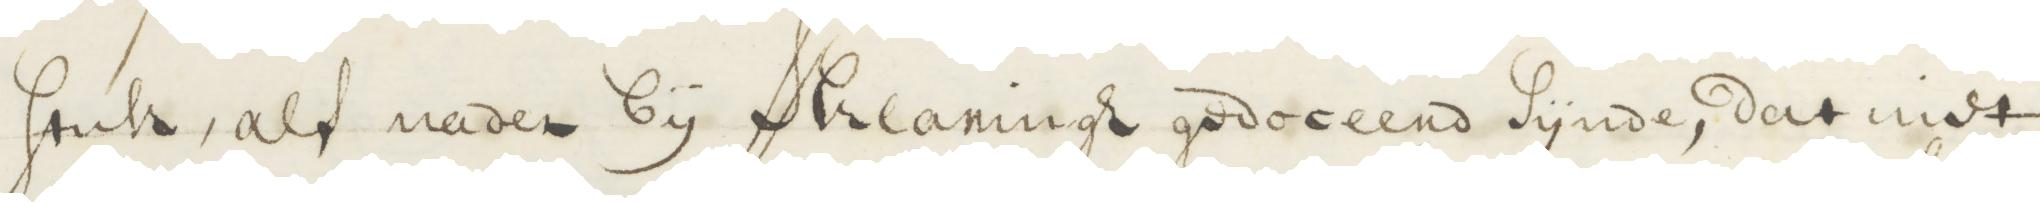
stuk, als nader bij verklaringh gedoceerd sijnde, dat niet
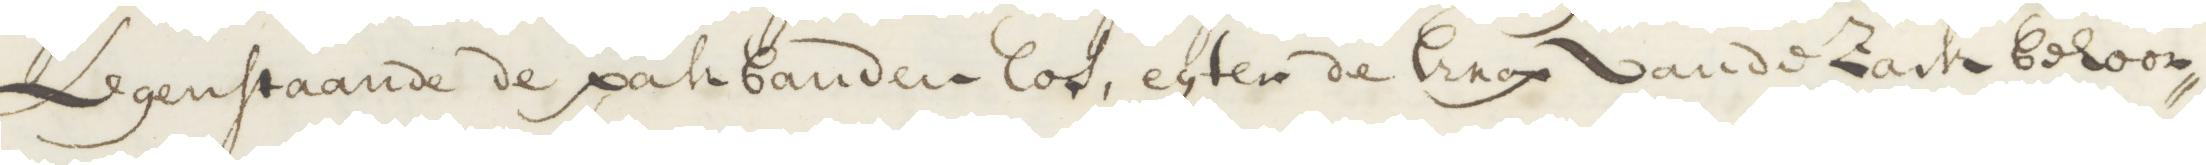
tegenstaande de pakbanden los, egter de krop van de zack behoor„
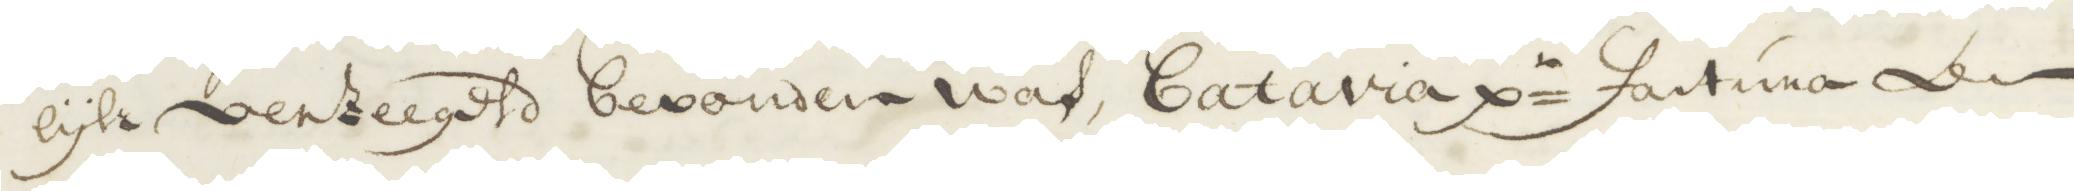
lijk verzeegeld bevonden was, batavia p=r factura ten
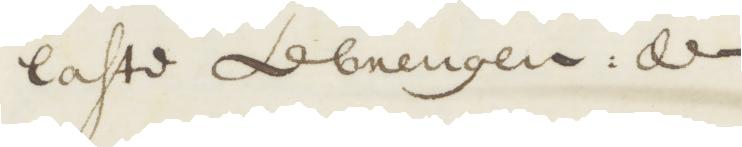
laste te brengen: de
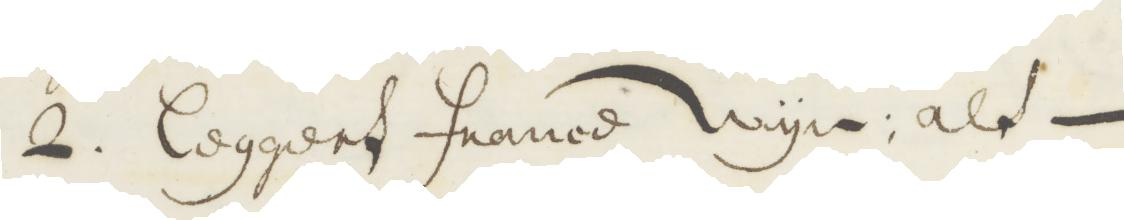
2. leggers france wijn; als —
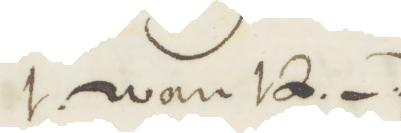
1. van 12.–
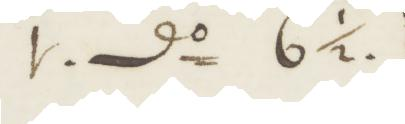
1. _=o 6½.
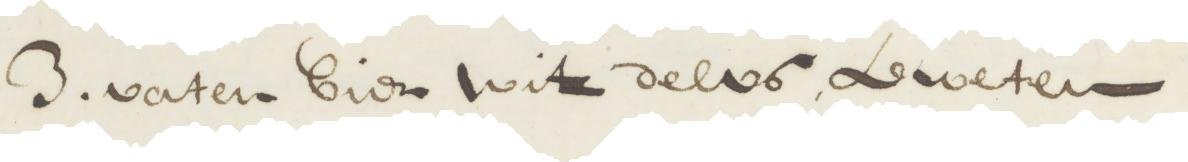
3. vaten bier wit delvs, te weten
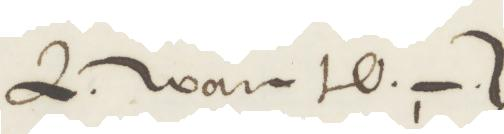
2. wan 10.—.
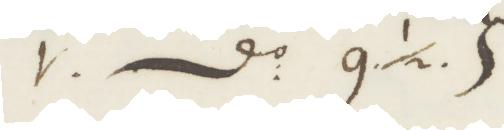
1. _:o 9.½.
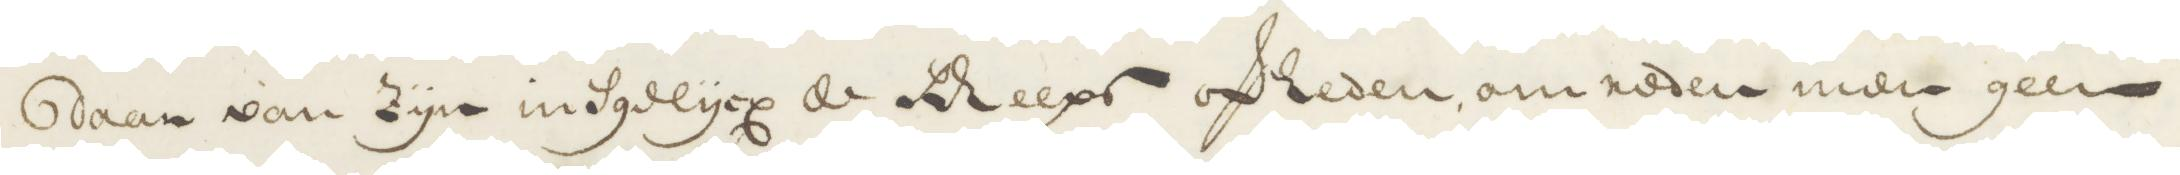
daar van zijn insgelijcx de scheeps overheden, om reden men geen
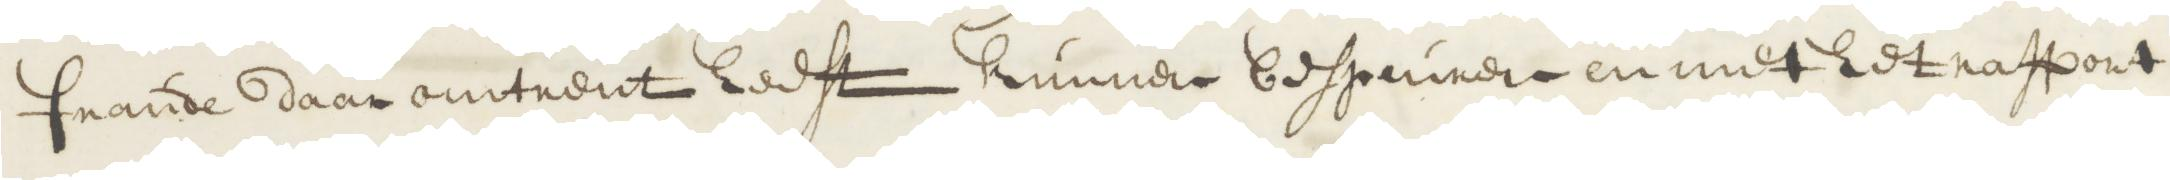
fraude daar omtrent heeft kunnen bespeuren en met het rapport
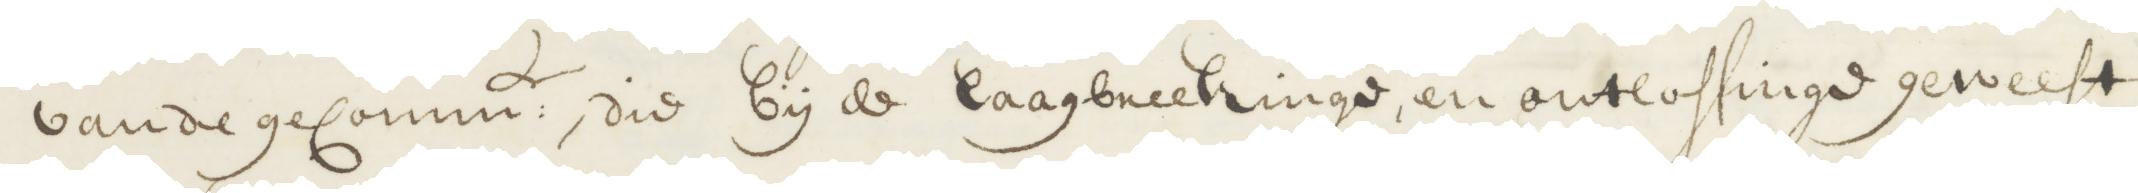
van de gecomm:s, die bij de laagbreekinge, en ontlossinge geweest
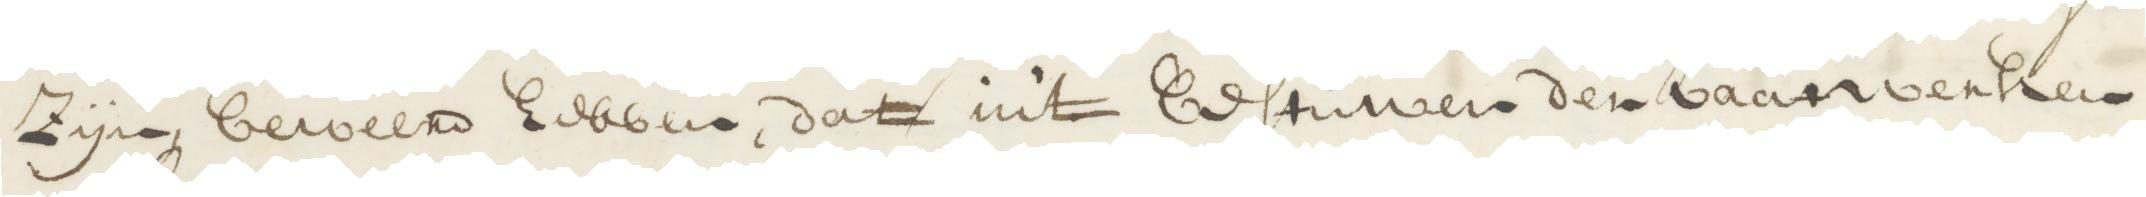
zijn, beweerd hebben, dat in ’t bestuwen der vaatwerken
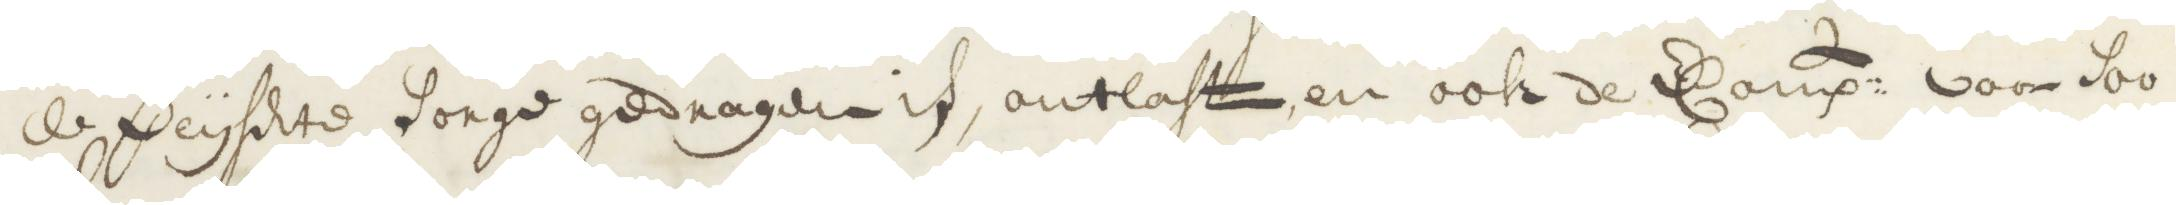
de vereijschte sorge gedragen is, ontlast, en ook de Comp: voor soo
